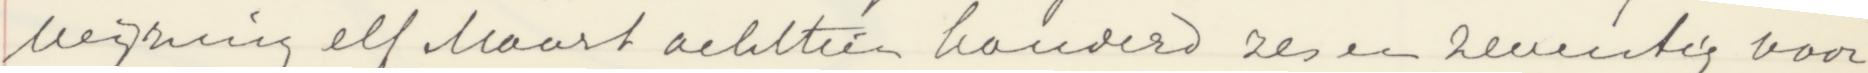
wijzing elf Maart achttien honderd zes en zeventig voor
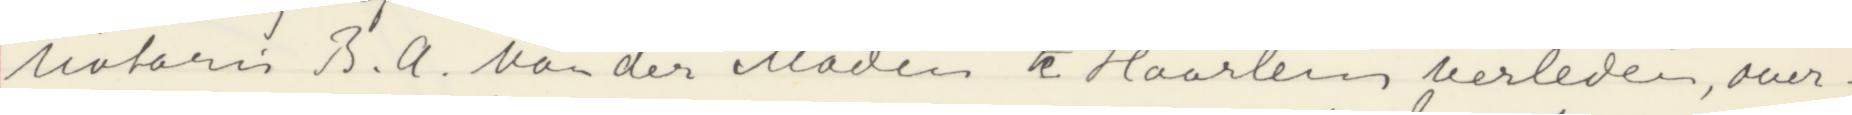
notaris B.A.. van der Maden te Haarlem verleden, over
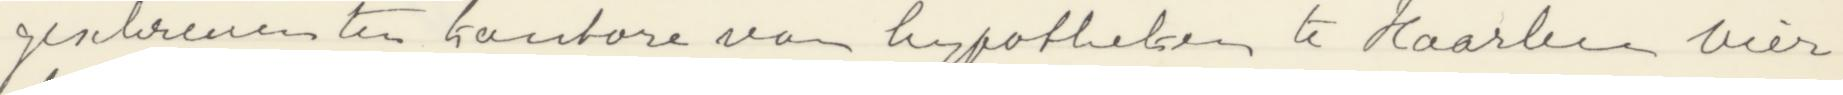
geschreven ten kantore van hypotheken te Haarlem vier
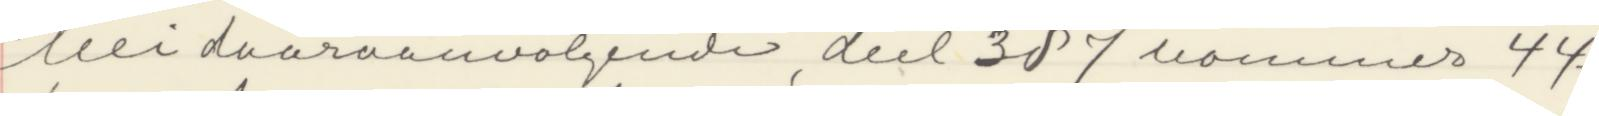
Mei daaraanvolgende, deel 387 nommer 44-
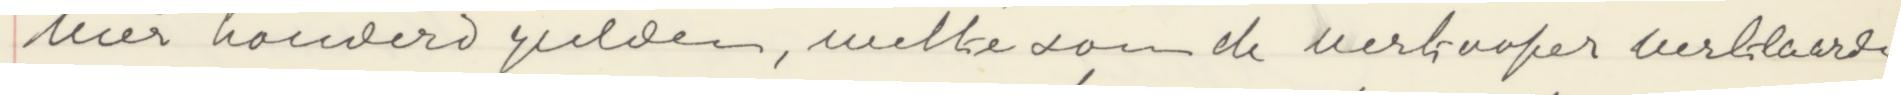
vier honderd gulden, welke som de verkooper verklaarde
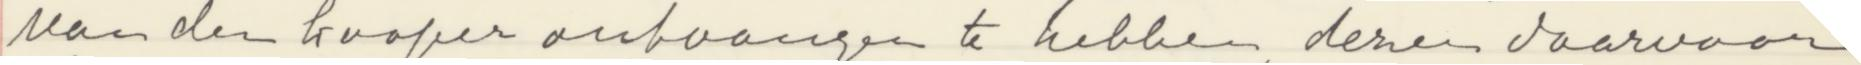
van den kooper ontvangen te hebben, dezen daarvoor
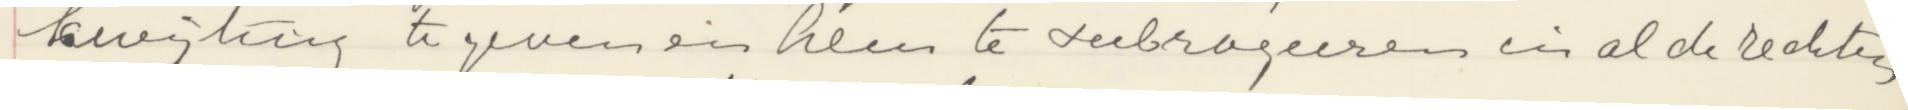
kwijting te geven en hem te subrogeeren in al de rechten
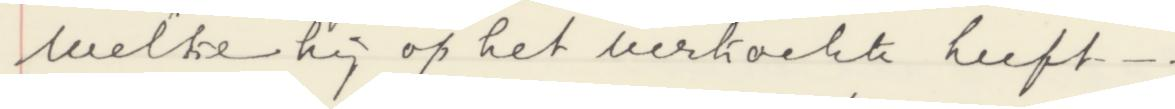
welke hij op het verkochte heeft —
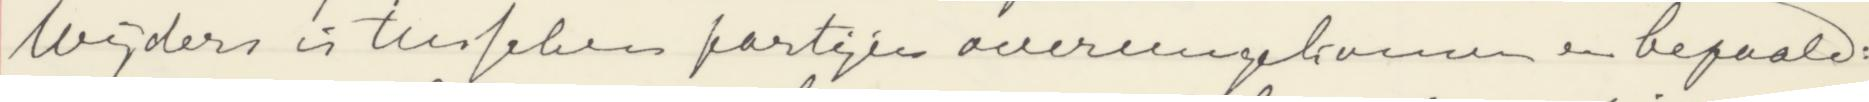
Wijders is tusschen partijen overeengekomen en bepaald
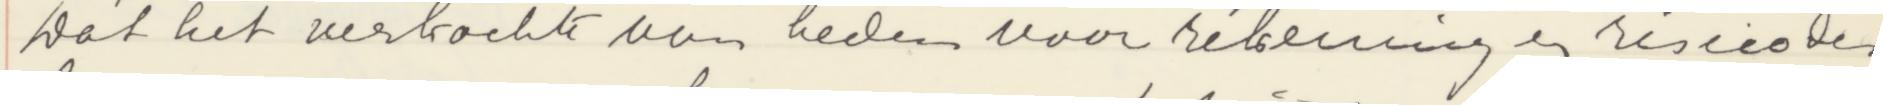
Dat het verkochte van heden voor rekening en risico der
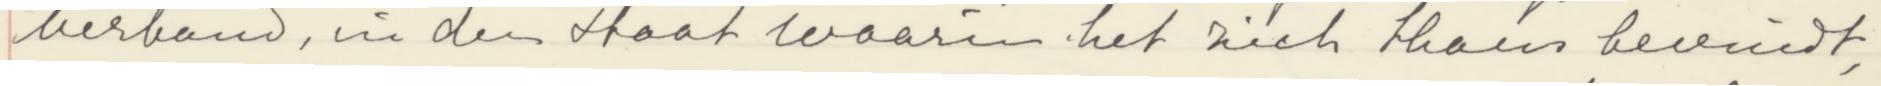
verband, in den staat waarin het zich thans bevindt,
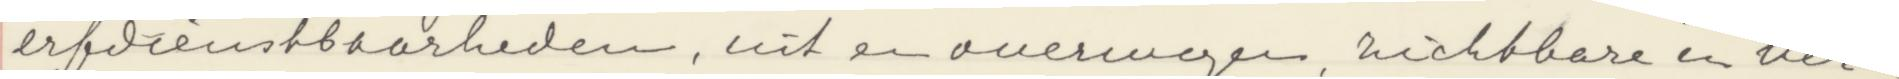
erfdienstbaarheden, uit en overwegen, zichtbare en ver-
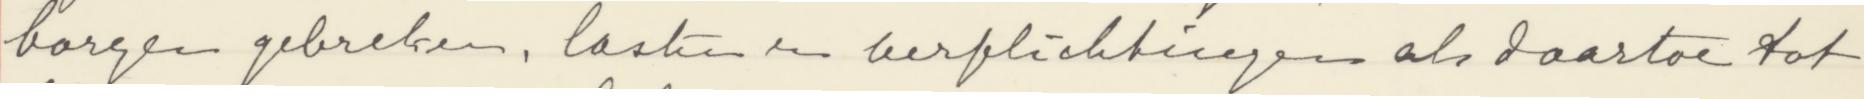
borgen gebreken, lasten en verplichtingen als daartoe tot
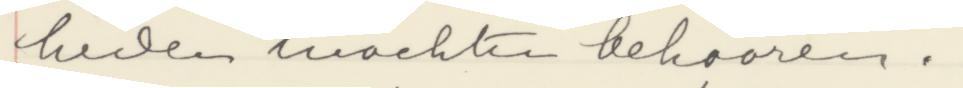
heden mochten behooren.
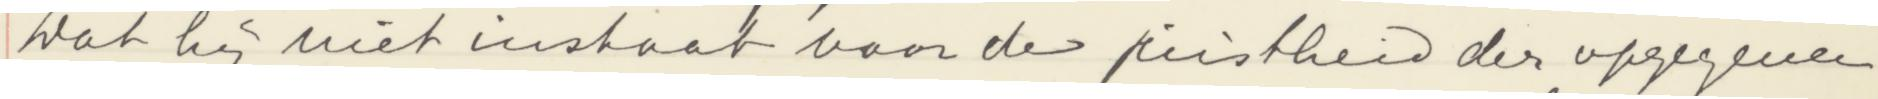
Dat hij niet instaat voor de juistheid der opgegeven
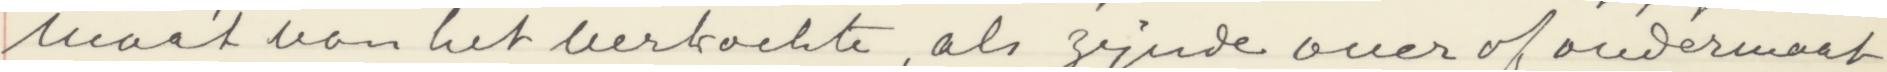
maat van het verkochte, als zijnde over of ondermaat
